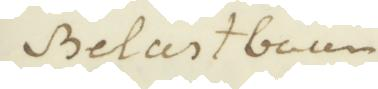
Belastbaar
